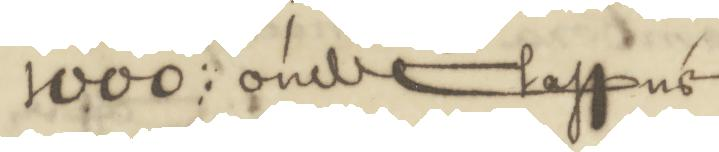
1000: oude clappus
